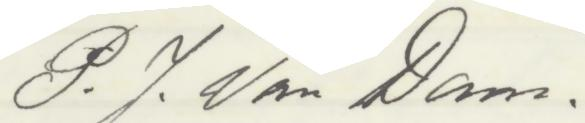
P. J. Van Dam.
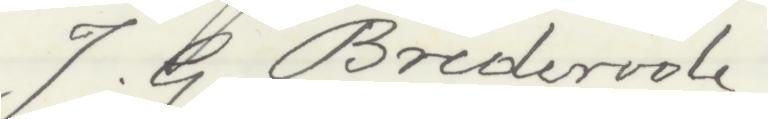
J. G Brederoode
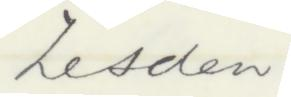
Zesden
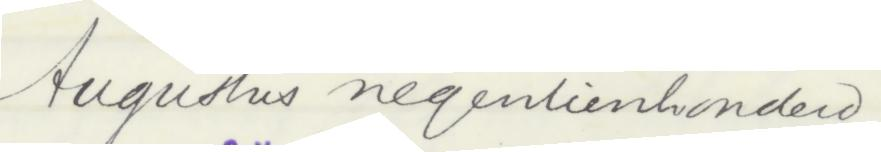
Augustus negentienhonderd
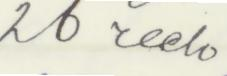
26 recto
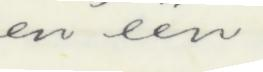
en één
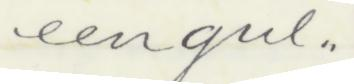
een gul„
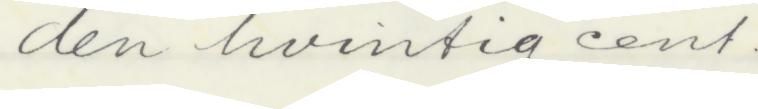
den twintig cent
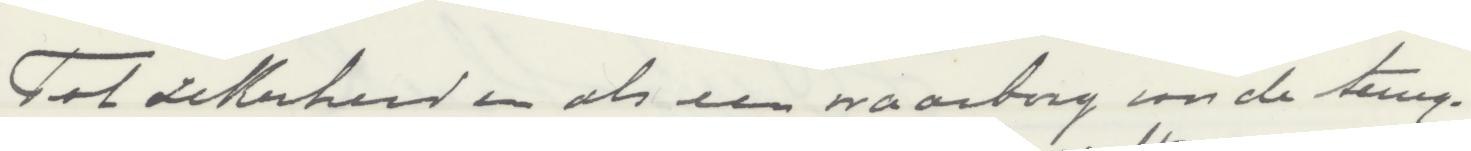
tot zekerheid en als een waarborg voor de terug-
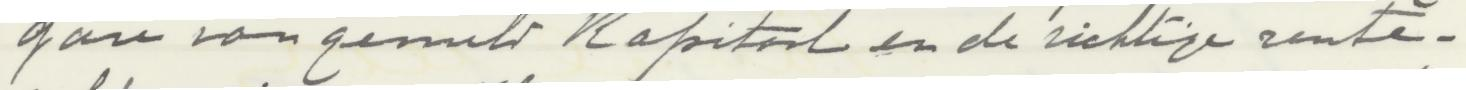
gave van gemeld Kapitaal en de richtige rente-
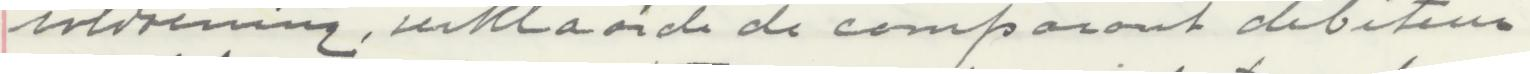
voldoening, verklaarde de comparant debiteur
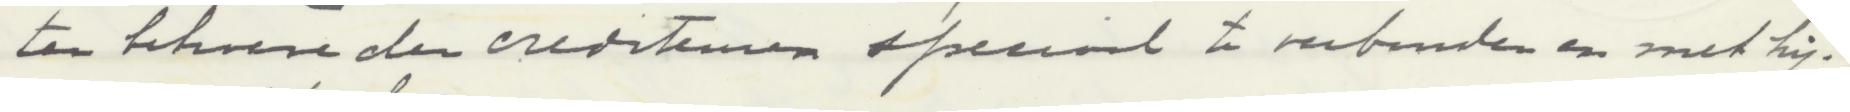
ten behoeve der crediteuren speciaal te verbinden en met hij-
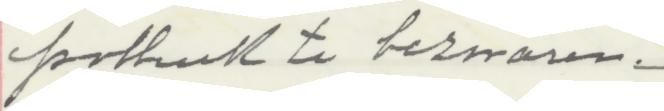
potheek te bezwaren.
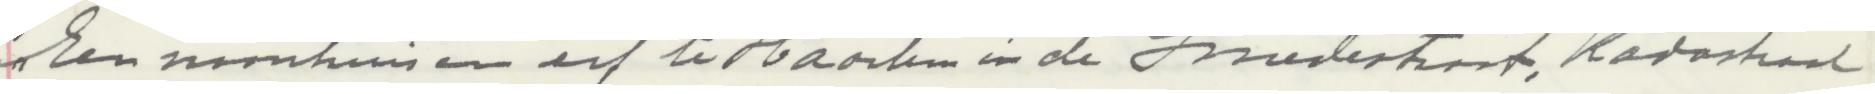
„ Een woonhuis en erf te Haarlem in de Smeedestraat, kadastraal
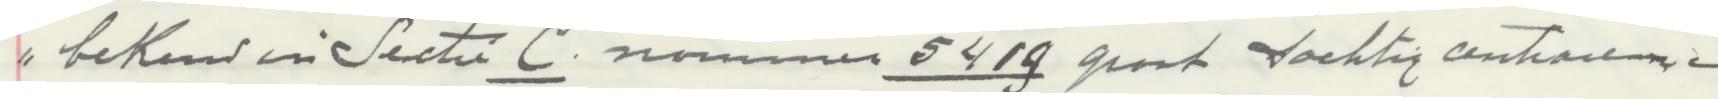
„ bekend in Sectie C. nommer 5419 groot tachtig centiaren.
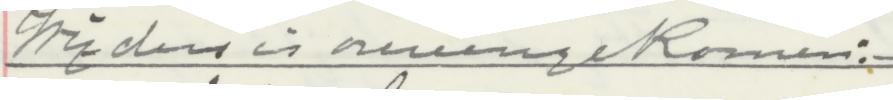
Wijders is overeengekomen:
